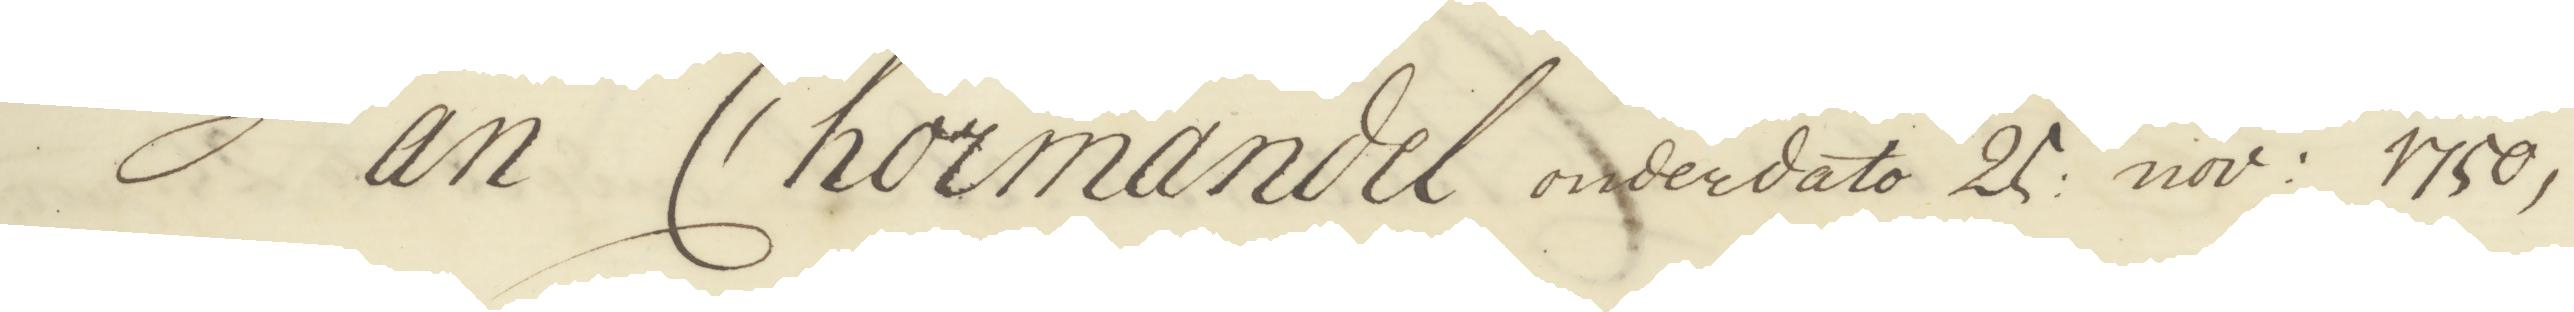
Van Chormandel onder dato 25:en nov: 1750,
